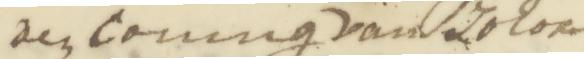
den Coning van Iohor
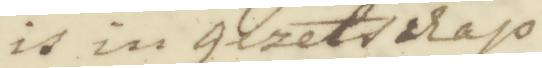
is in gezelschap
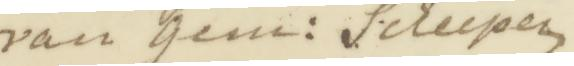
van gem: scheepen
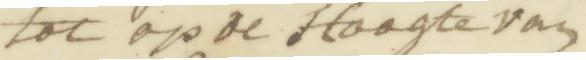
tot op de Hoogte van
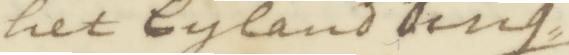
het Eyland ding„
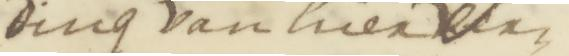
ding van hier ver„
